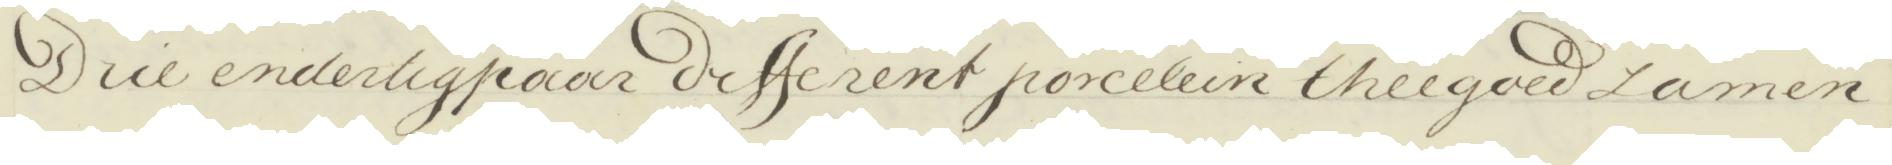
Drie en dertig paar different porcelein theegoed zamen
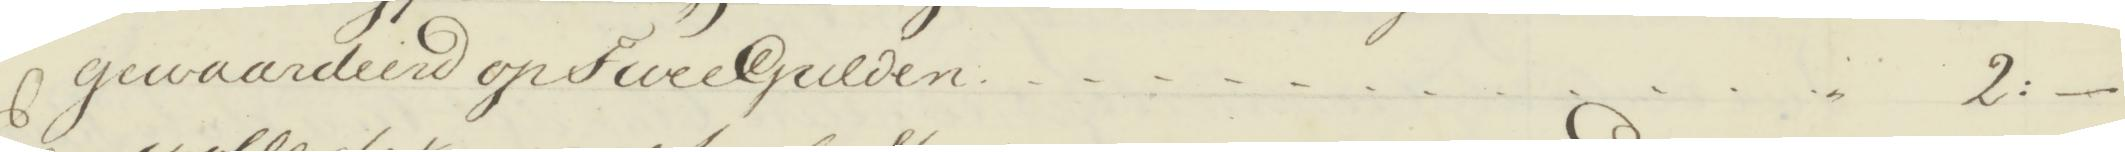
gewaardeerd op Twee Gulden. . . . . . . . . . . . . . . ƒ 2: —
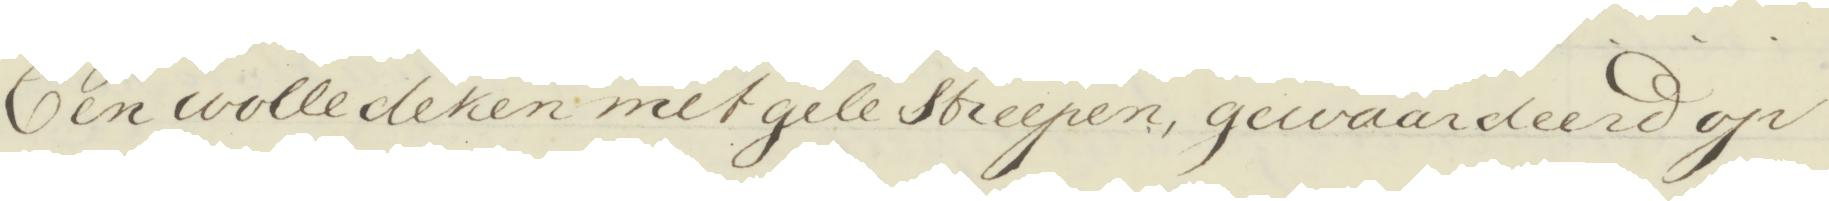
Een wolle deken met gele Streepen, gewaardeerd op
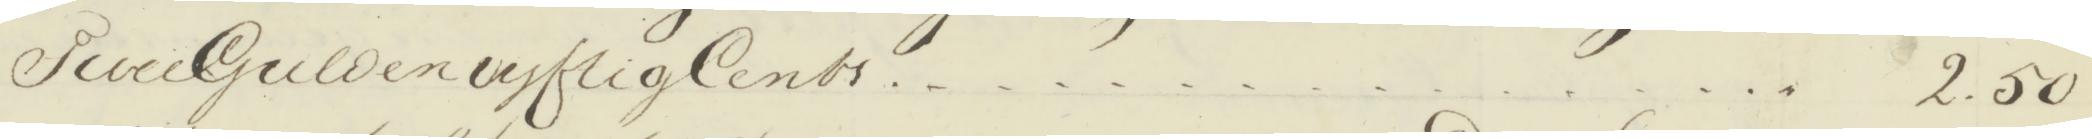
Twee Gulden vyftig Cents. . . . . . . . . . . . . . . . „ - 2. 50
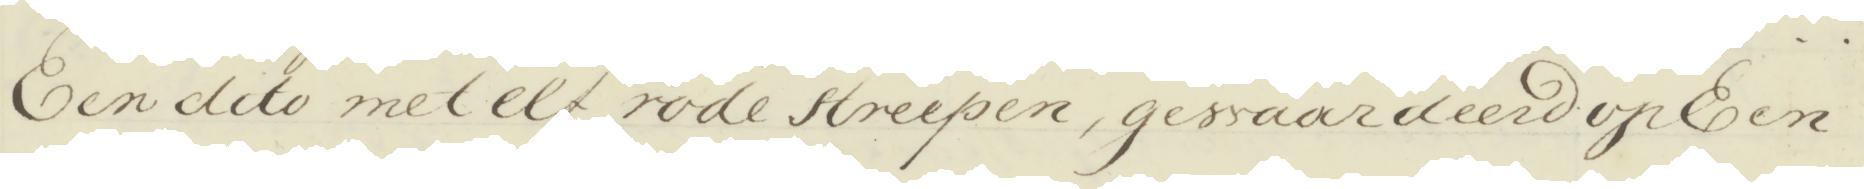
Een dito met elf rode streepen, gewaardeerd op Een
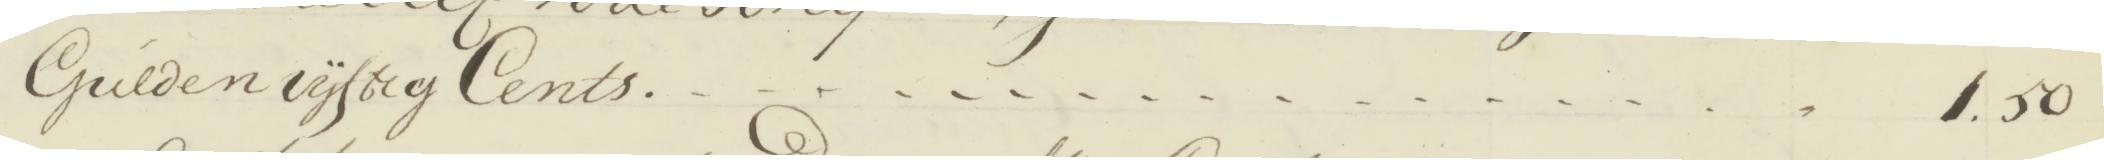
Gulden vijftig Cents. . . . . . . . . . . . . . . . . . . . „ 1.50
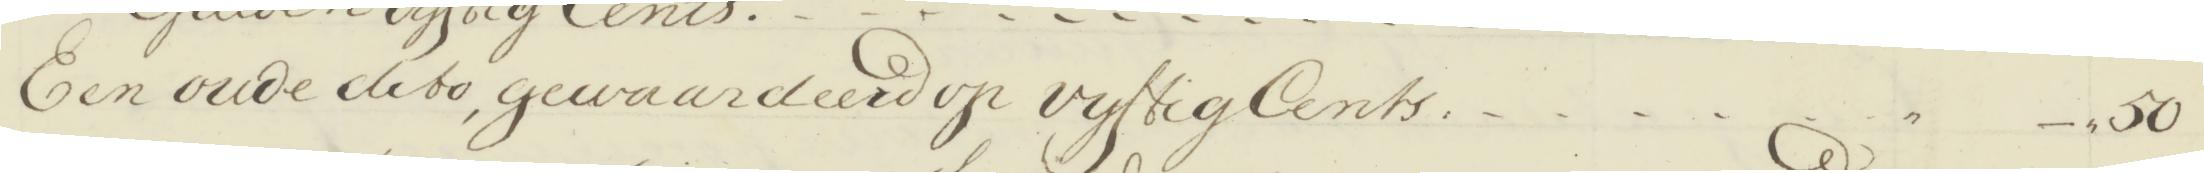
Een oude dito, gewaardeerd op vyftig Cents. . . . . . . „ - „ 50
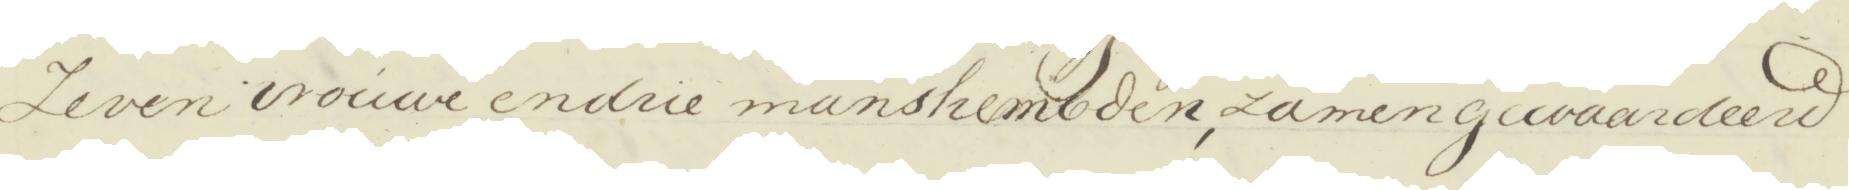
Zeven vrouwe en drie manshembden, zamen gewaardeerd
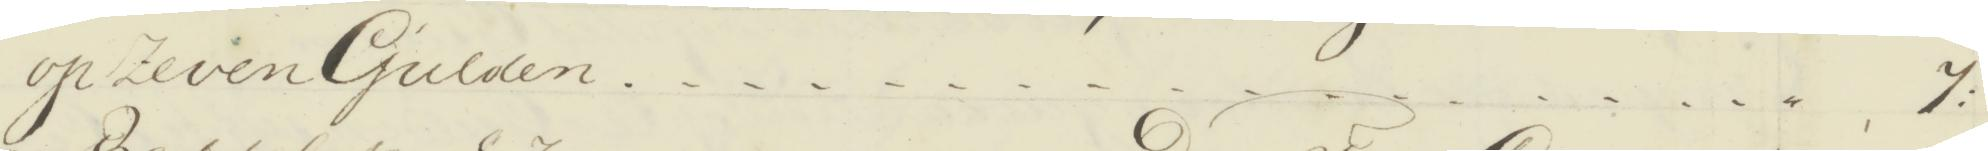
op zeven Gulden. . . . . . . . . . . . . . . . . . . . .„ 7:
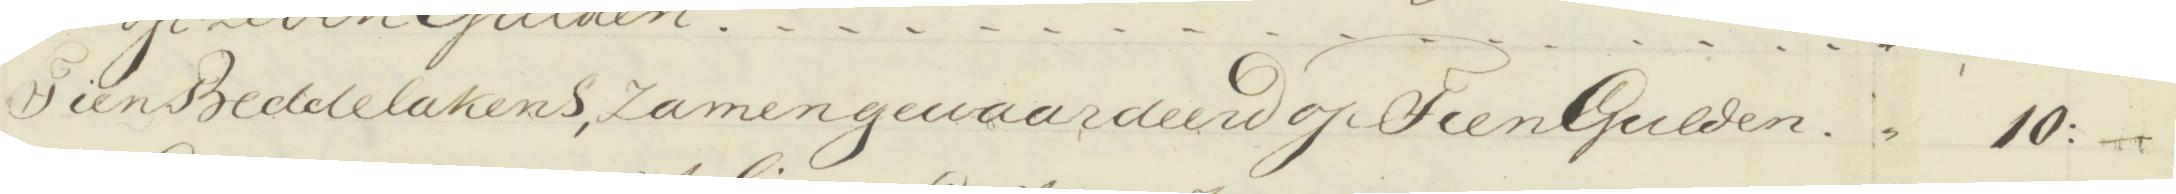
Tien Beddelakens, zamen gewaardeerd op Tien Gulden. „ 10: —:
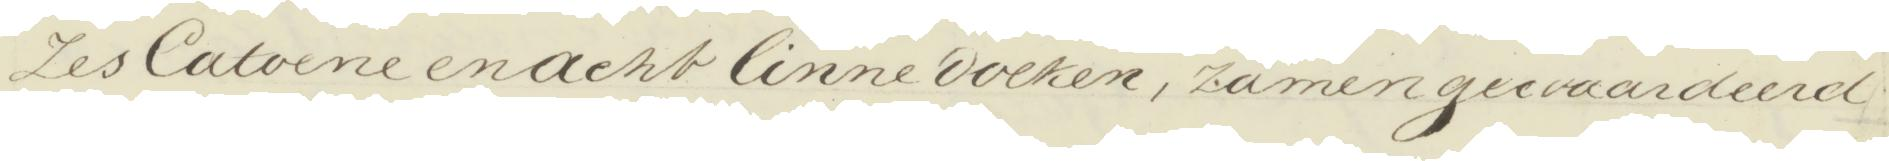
Zes Catoene en acht linnedoeken, zamen gewaardeerd
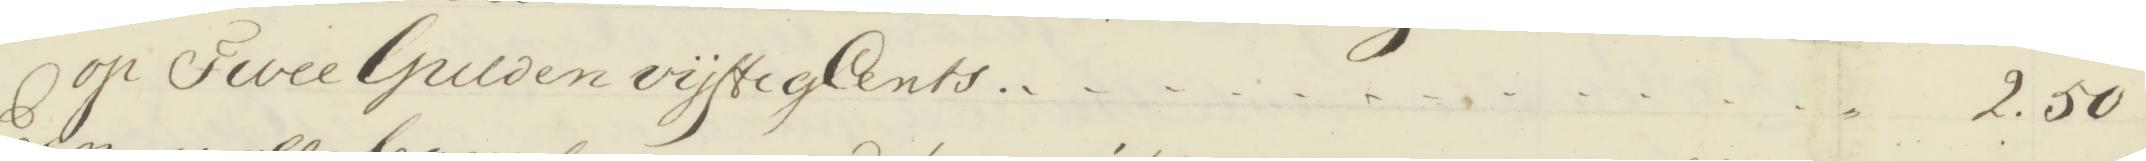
op Twee Gulden vijftig Cents. . . . . . . . . . . . . . . . „ 2. 50
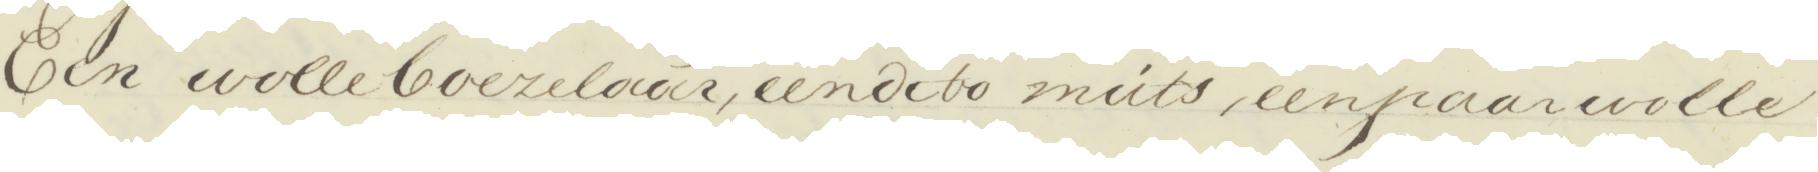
Een wolle boezelaar, een dito muts, een paar wolle
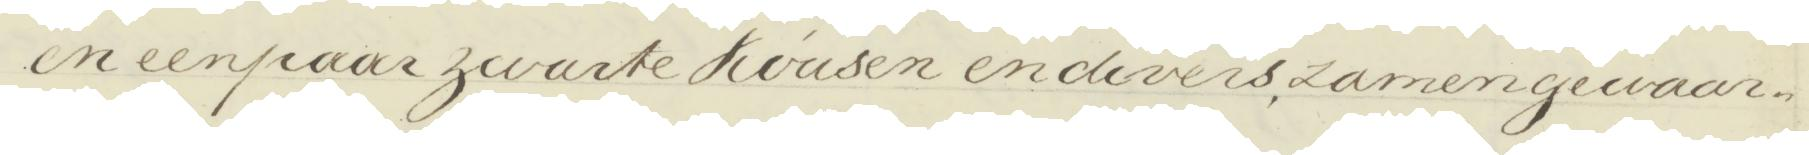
en een paar zwarte Kousen en divers zamen gewaar„
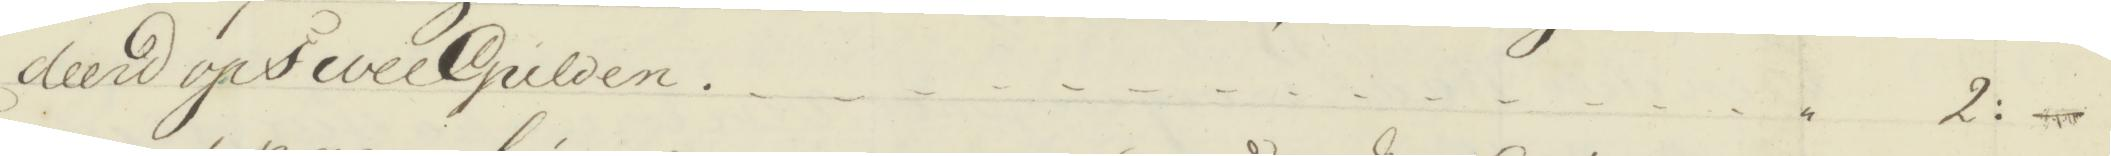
deerd op Twee Gulden. . . . . . . . . . . . . . . . . . . . „ 2: -
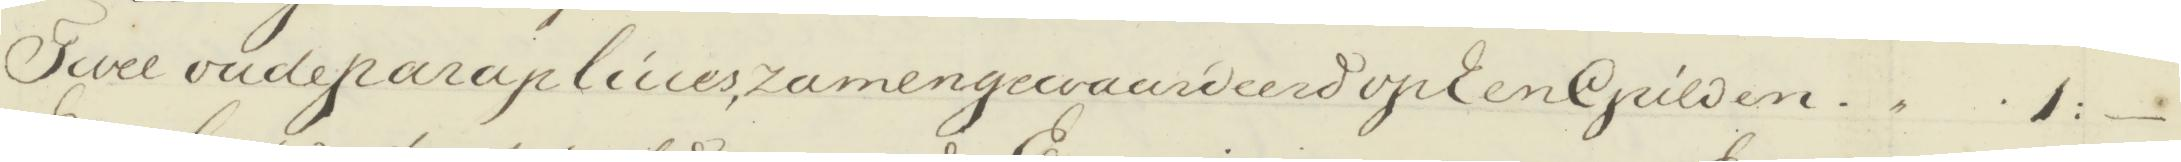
Twee oude parapluies, zamen gewaardeerd op Een Gulden.„ 1: -
